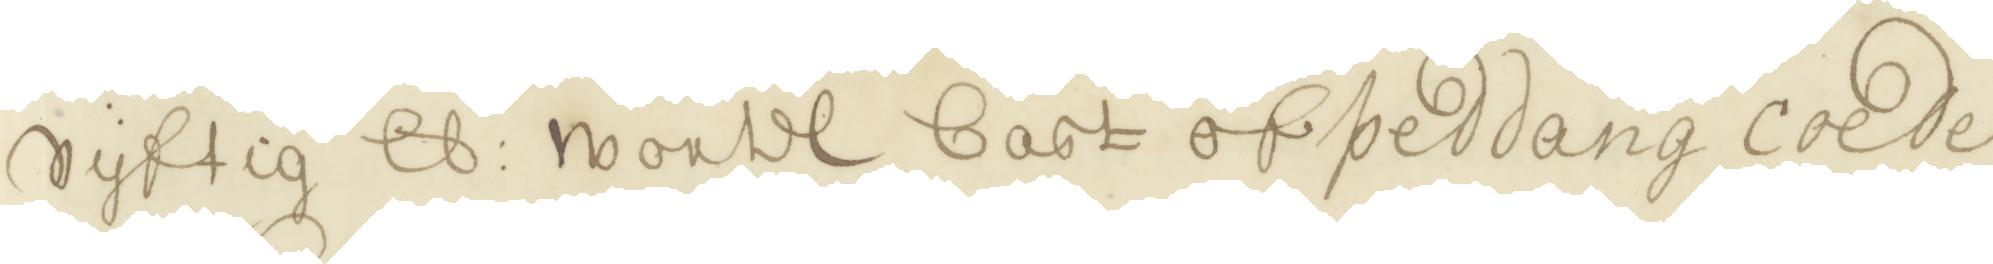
vijftig lb: wortel bast of peddang coede
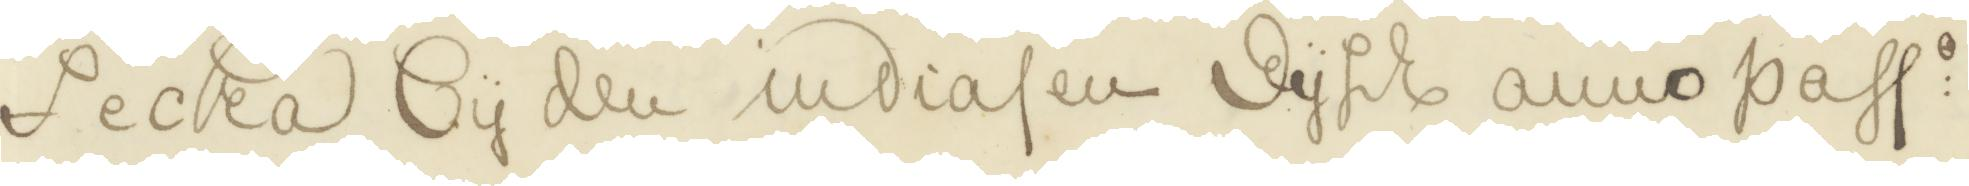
Secka bij den indiasen Eijsch anno pass:o
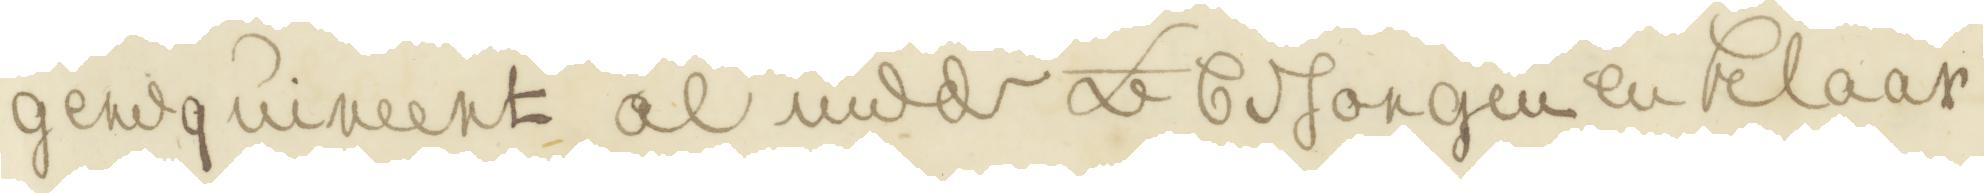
gerequireert al mede te besorgen en klaar
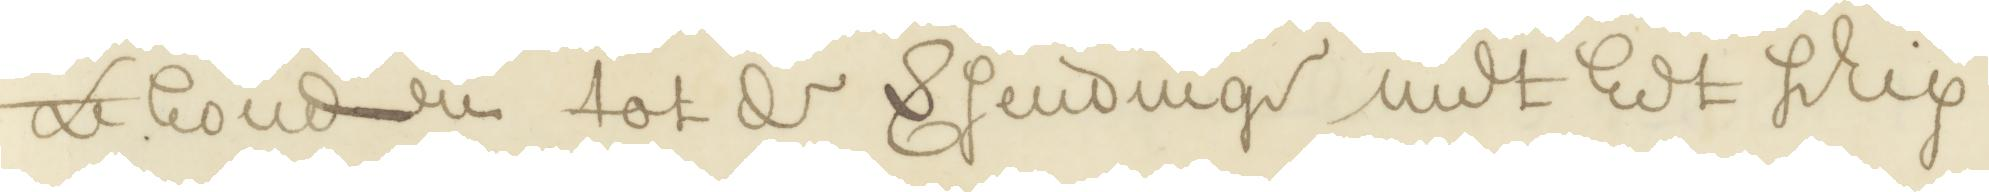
te houden tot de versendinge met het schip
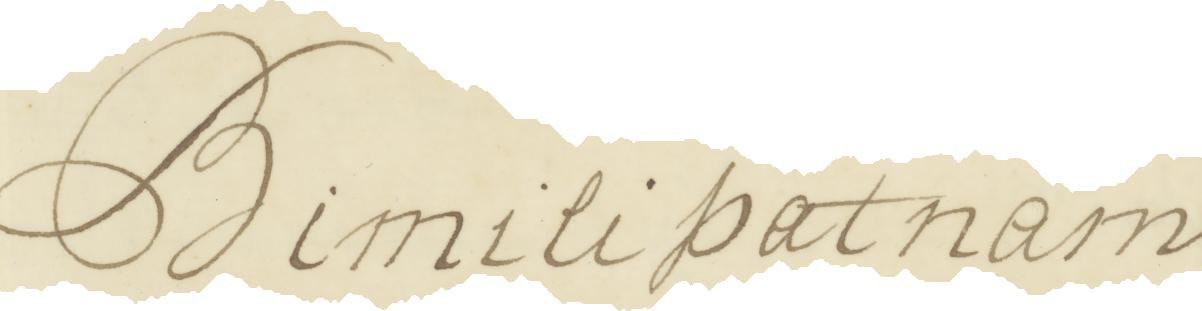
Bimilipatnam
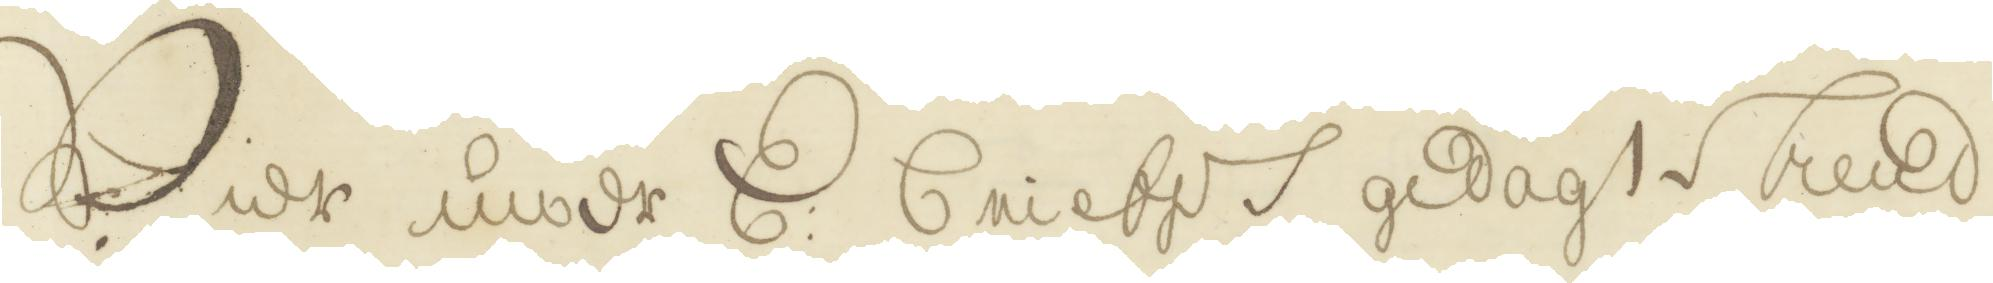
Vier uwer E: briefjes gedagtekend
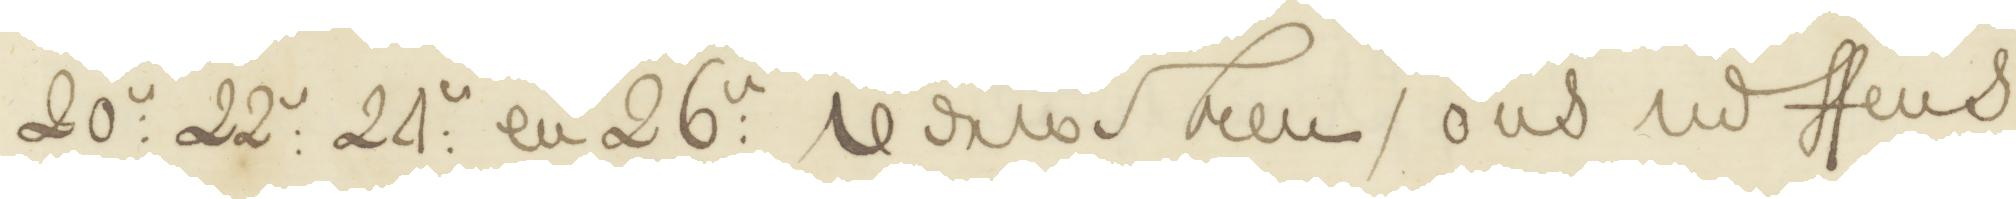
20:' 22:' 24:' en 26:' verweken / ons neffens
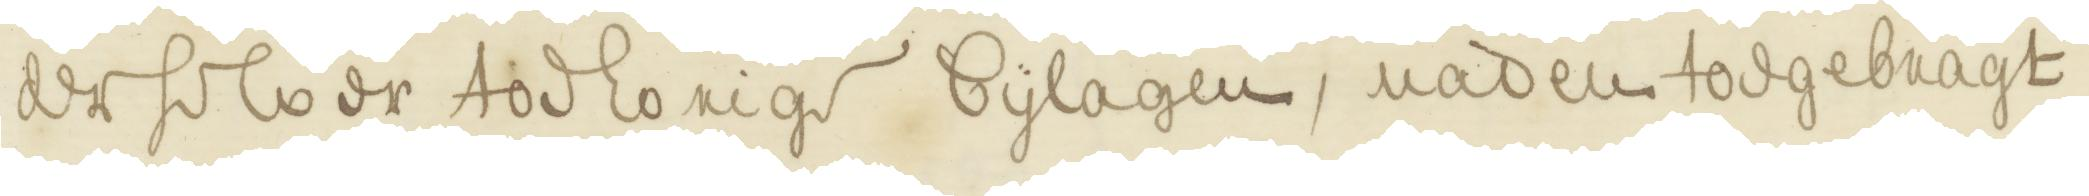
derselver toehorige bijlagen, naden toegebragt
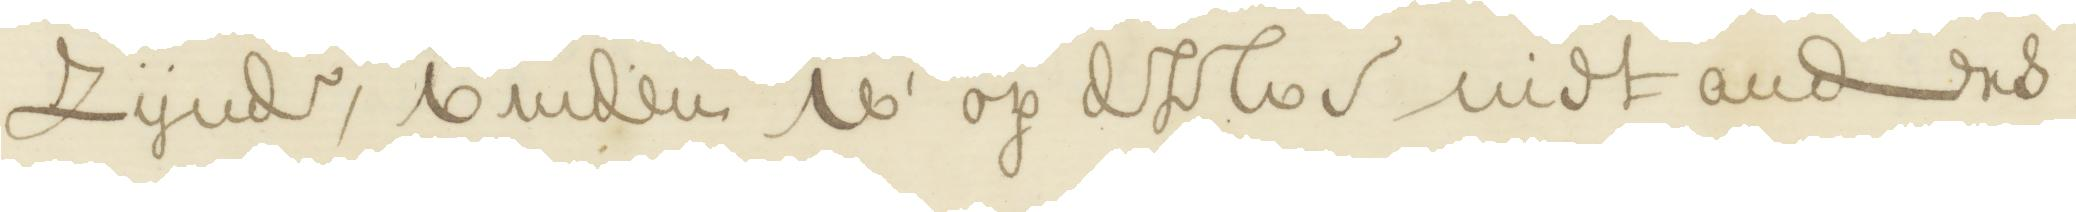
zijnde, vinden w' op deselve niet anders
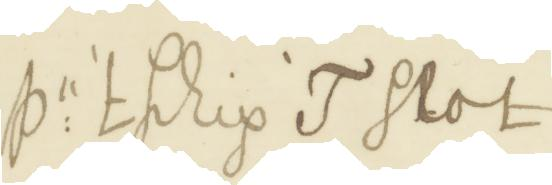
p:r 't schip 'T stot
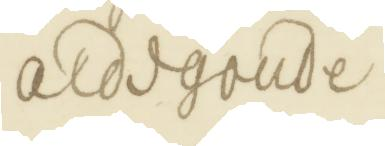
aldegonde
